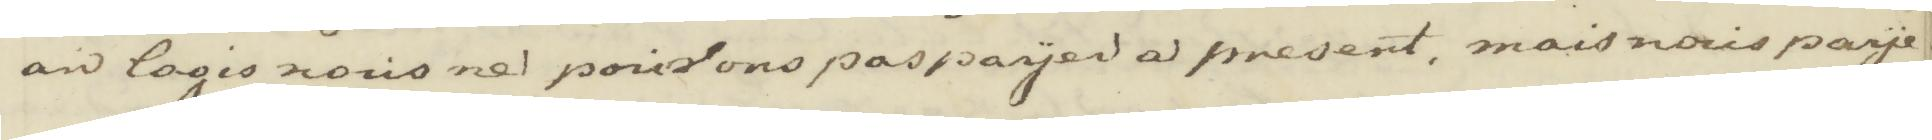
au logis nous ne pouvons pas paijer a present, mais nous paije
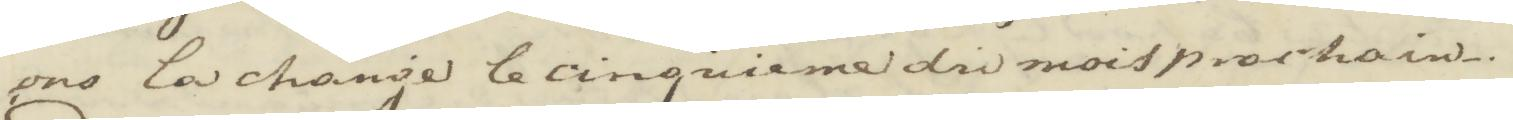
ons la change le cinquieme du mois prochain - .
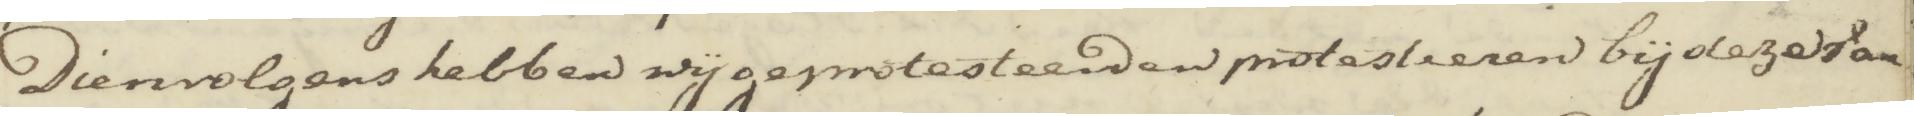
Dienvolgens hebben wij geprotesteerden protesteeren bij deze van
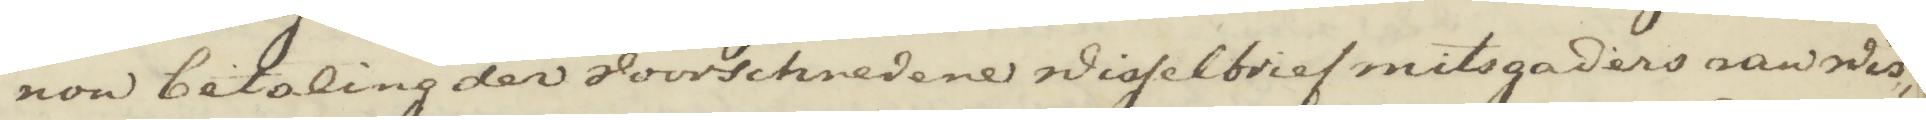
non betaling der voorschrevene wisselbrief mitsgaders van wis„
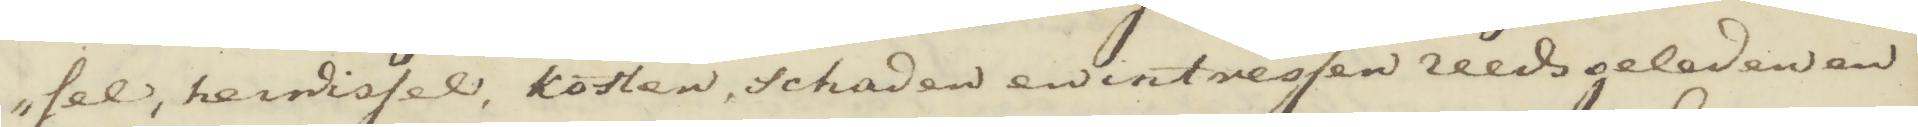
„sel, herwissel, kosten, schaden en intressen reeds geleden en
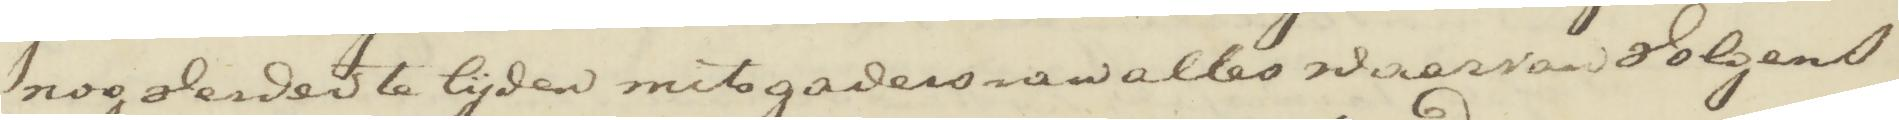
nog verder te lijden mitsgaders van alles waarvan Volgens
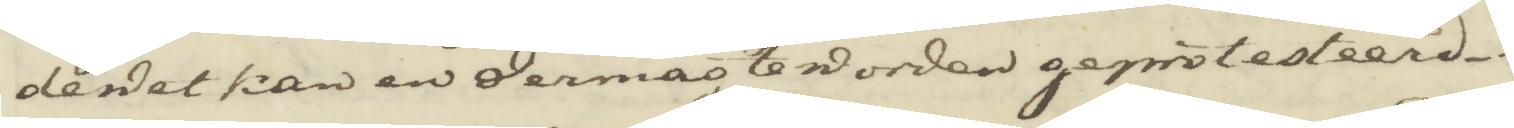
de wet kan en Vermag te worden geprotesteerd -.
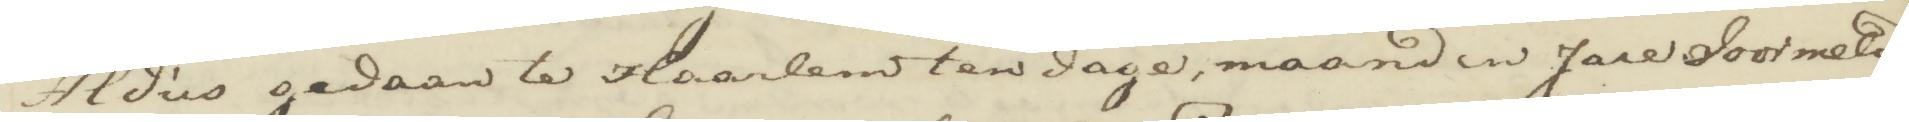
Aldus gedaan te Haarlem ten dage, maand en Jare Voormeld
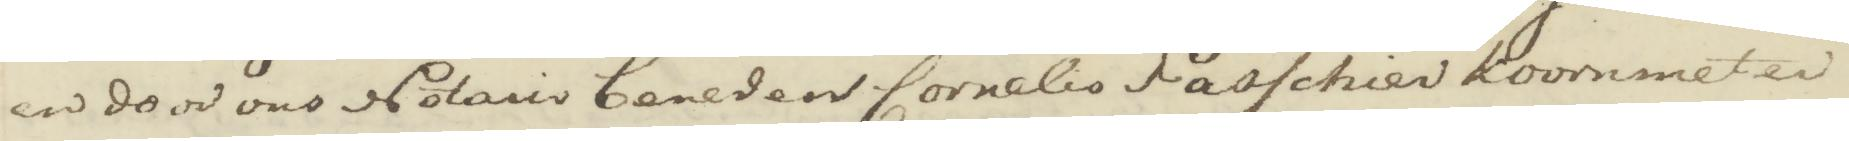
en door ons Notaris benevens Cornalis Passchier koornmeter
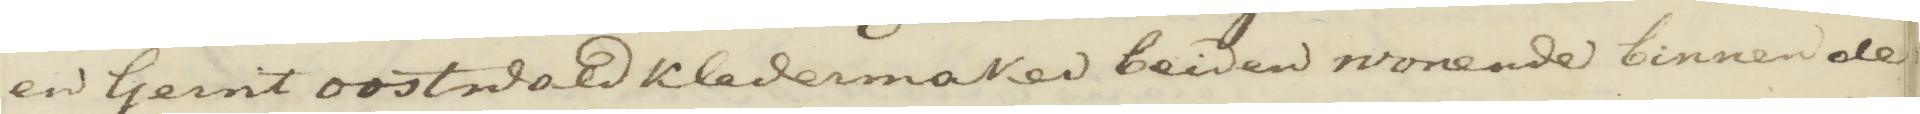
en Gerrit oostwald kledermaker beiden wonende binnen de
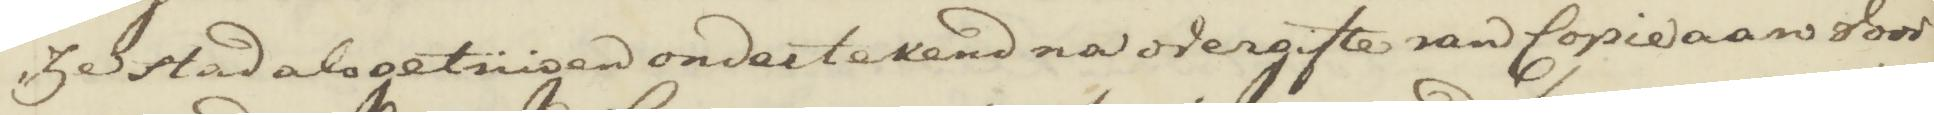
„ze stad als getuigen ondertekend na overgifte van Copie aan Voor
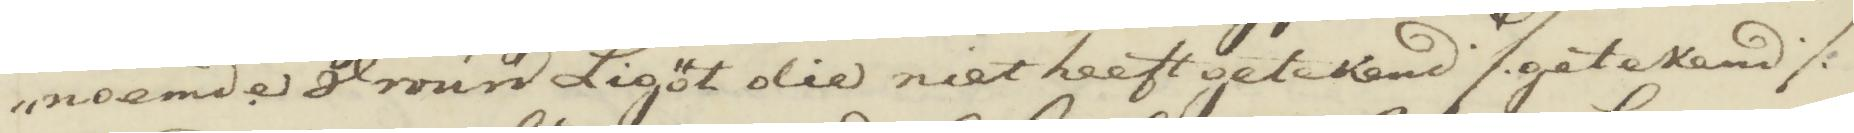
„noemde Vrouw Ligöt die niet heeft getekend ./.getekend ./.
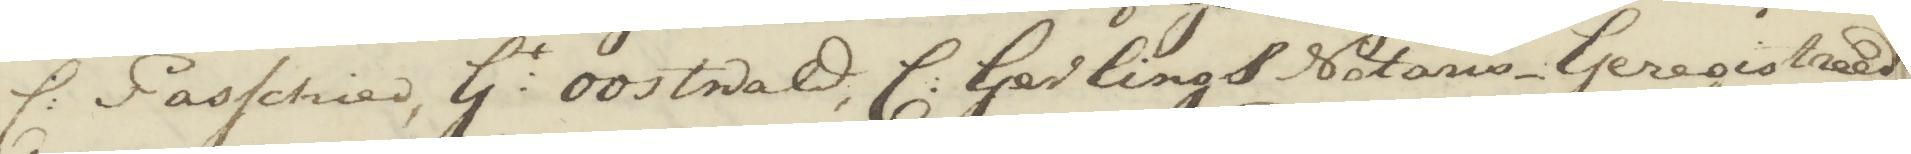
C: Passchier, G:t oostwald, C: Gerlings Notaris - . Geregistreerd
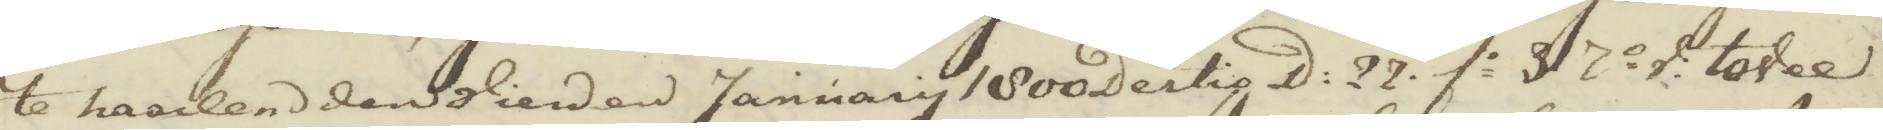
te haarlem den Vierden Januarij 1800 dertig D: 22. f=o 3 r=o V: twee
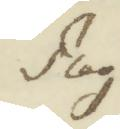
Reg ¼
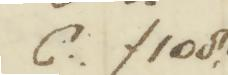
C. ƒ108.
